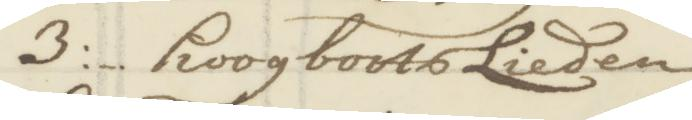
3:–. hoog bootsLieden
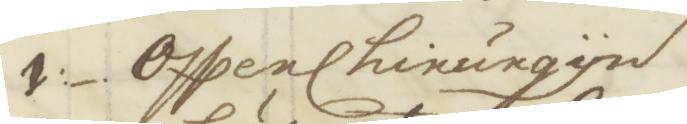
1:–. Opperchirurgijn
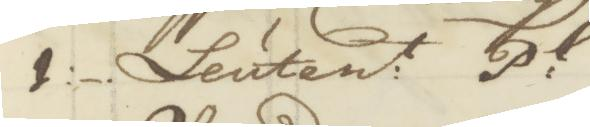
1:–. Leuten:t P:l
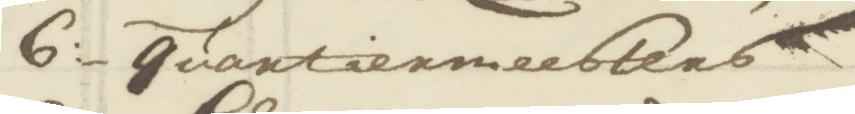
6:– quartiermeesters
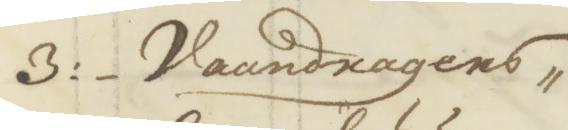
3:– Vaandragers„
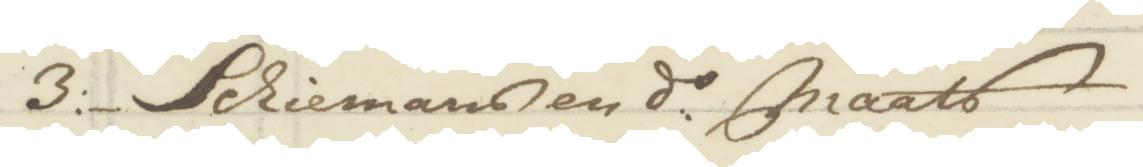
3:– Schiemans en d:o maats
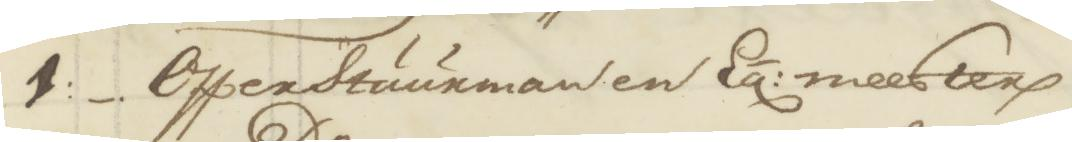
1:–. Opperstuurman en Eq: meester
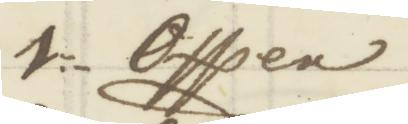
1:– Opper
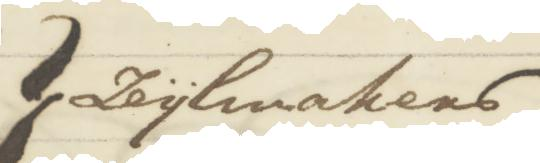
zeijlmakers
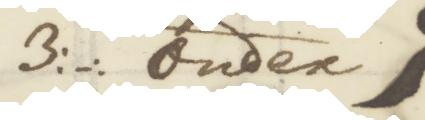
3:–: onder
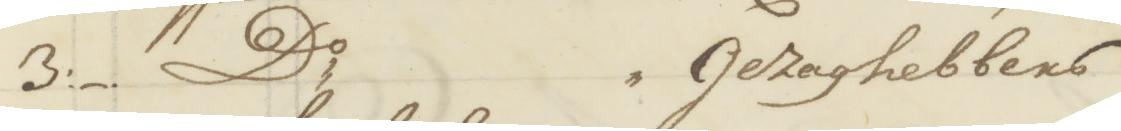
3:–. D„o „ Gezaghebbers
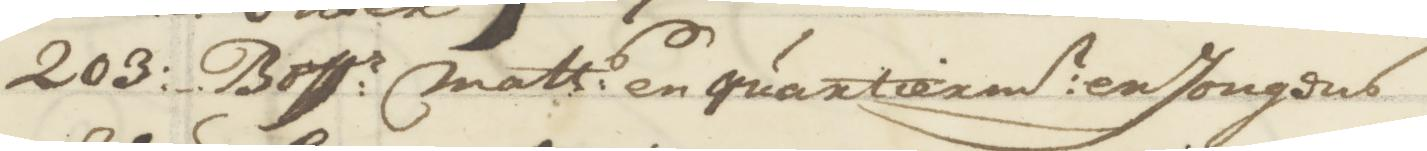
203:–. Boss:r matt:s en quartierm:r en Jongens
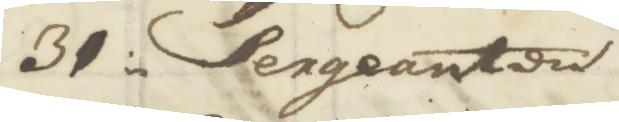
31:- Sergeanten
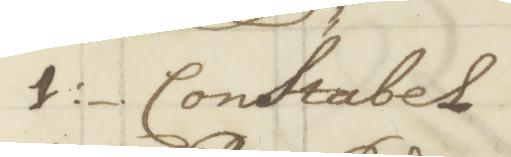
1:–. Constabel
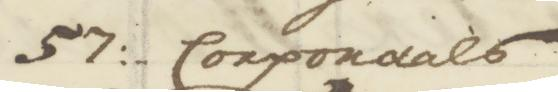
57:- Corporaals
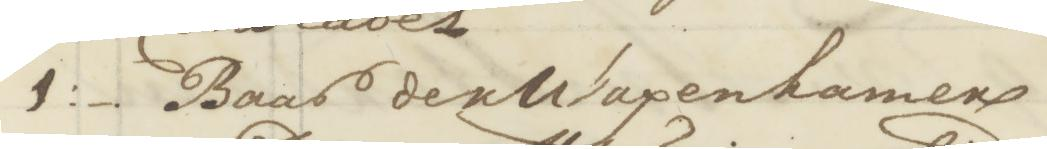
1:–. Baas der wapenkamer
